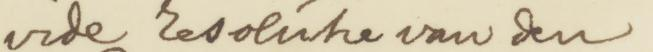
vide resolutie van den
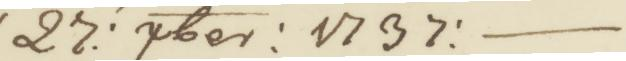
27:' xber: 1737: —
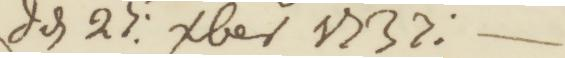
den 27:' xber 1737: —
